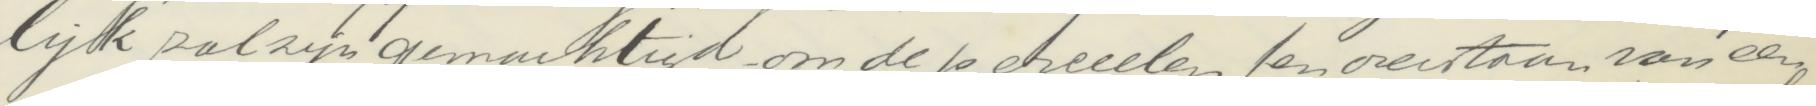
lijk zal zijn gemachtigd om de perceelen ten overstaan van een
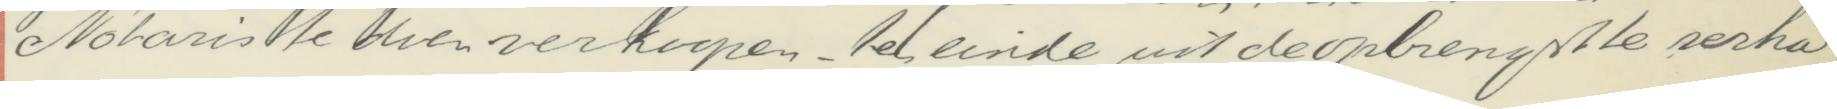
Notaris te doen verkoopen - ten einde uit de opbrengst te verha
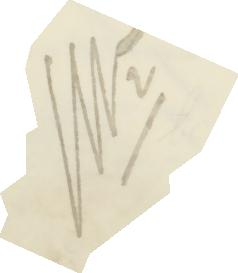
JWi
